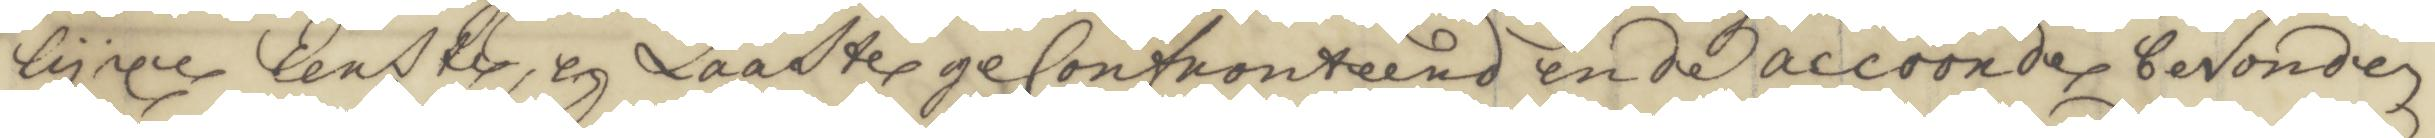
lijxe Eerste, en Laaste geconfronteerd en de accoorde bevonden
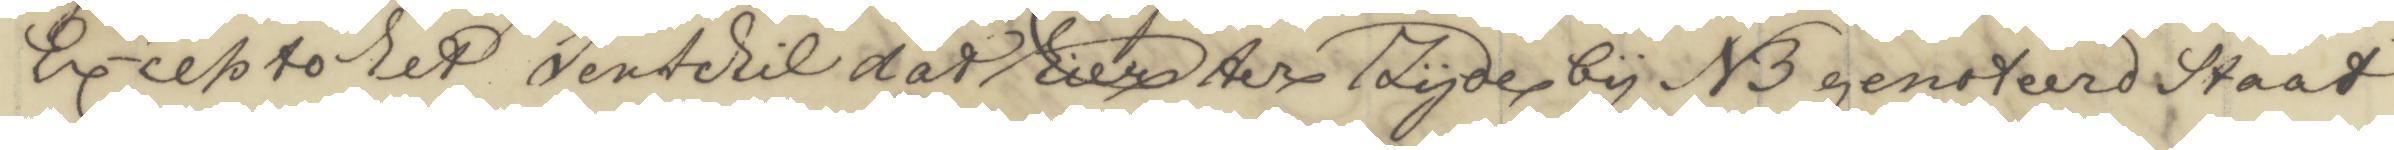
Excepto het verschil dat hier ter zijde bij N3 genoteerd staat
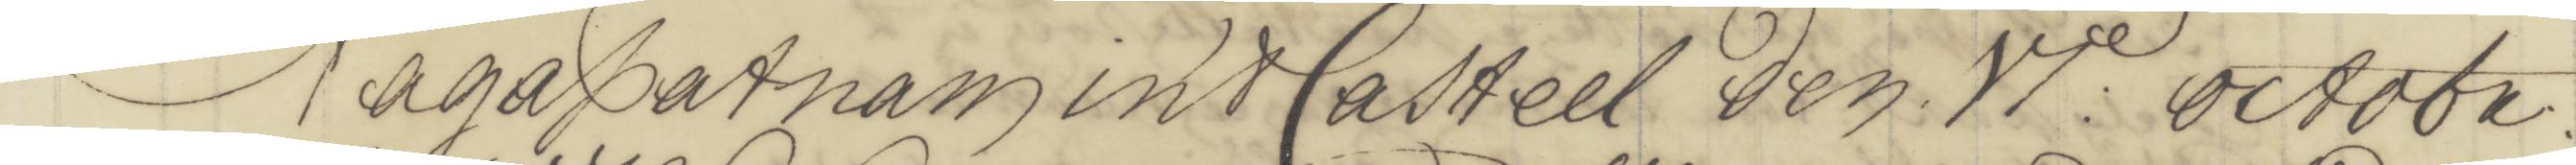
Nagapatnam in't Casteel den. 17:e octobr:
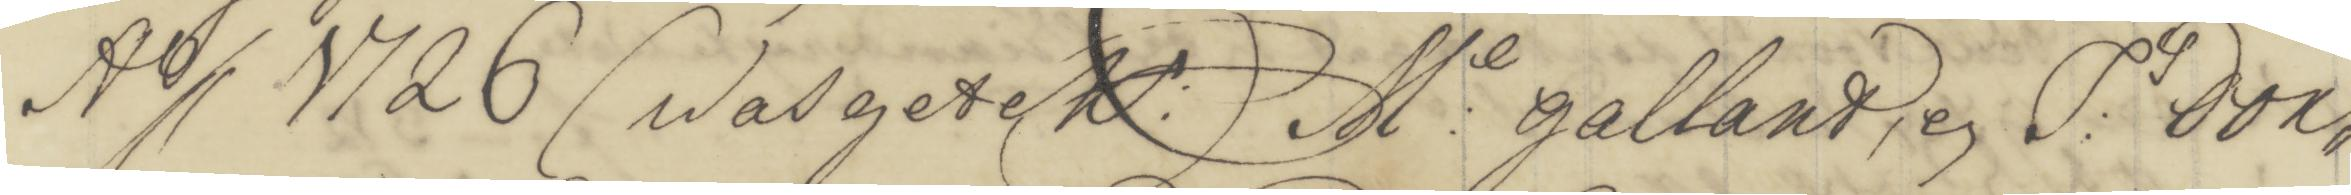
A„o 1726 (was getek:t) M:e gallant, en T:s dor„
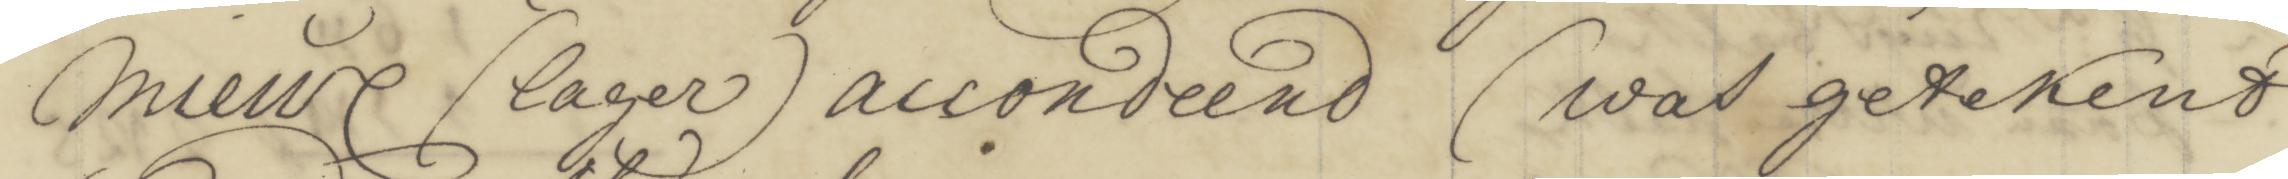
mieux (lager) accordeerd (was getekend)
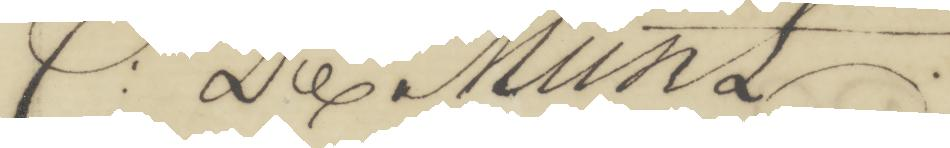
C: Die Munt.
